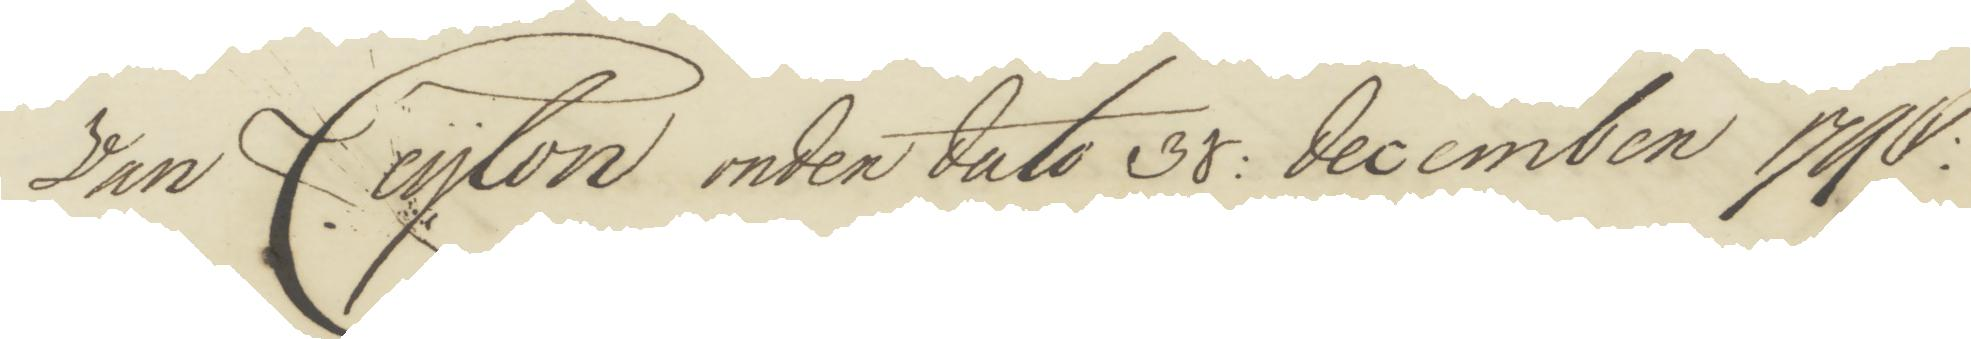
Van Ceijlon onder dato 31: december 1748:
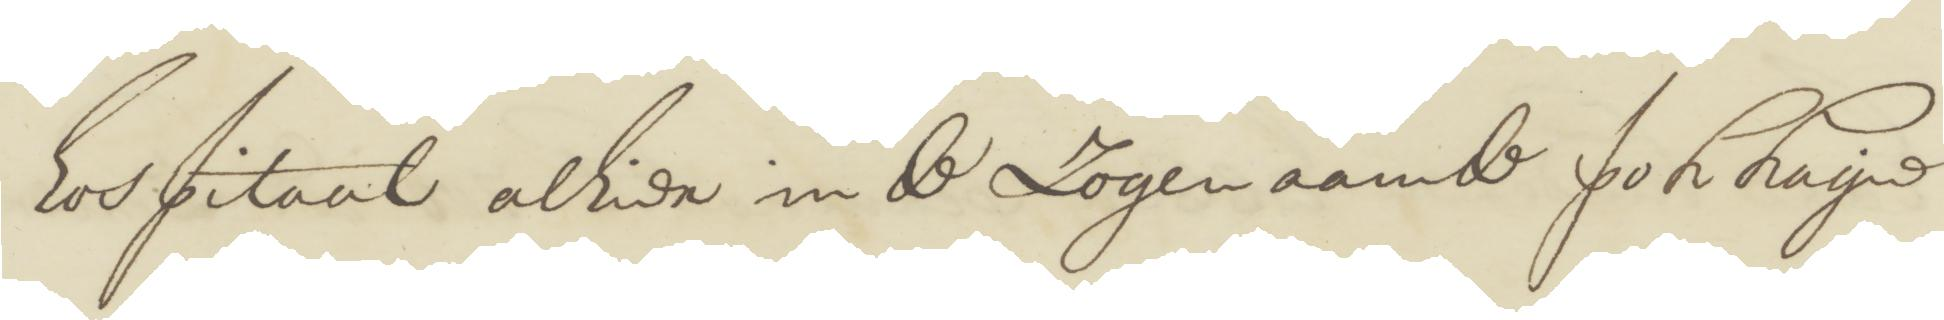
hospitaal alhier in de zogenaamde pokkaije
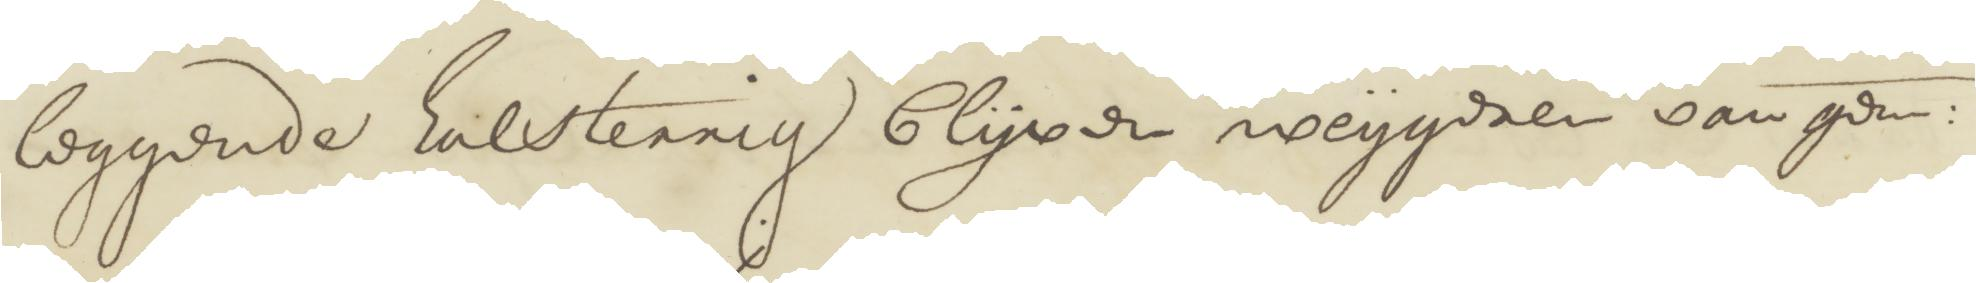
leggende halsterrig blijven weijgeren van gem:
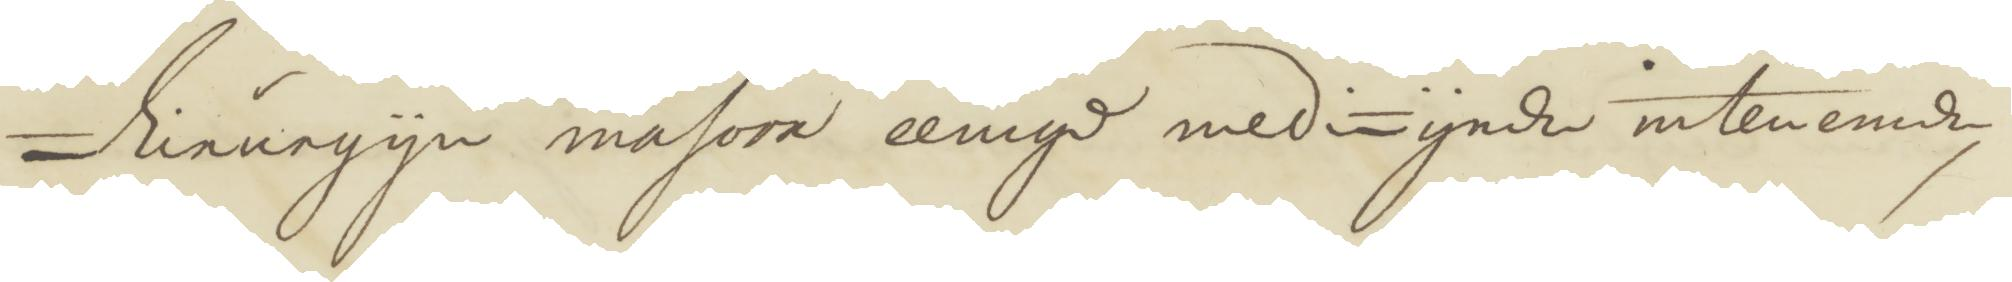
chirurgijn masoor eenige medicijnen intenemen,
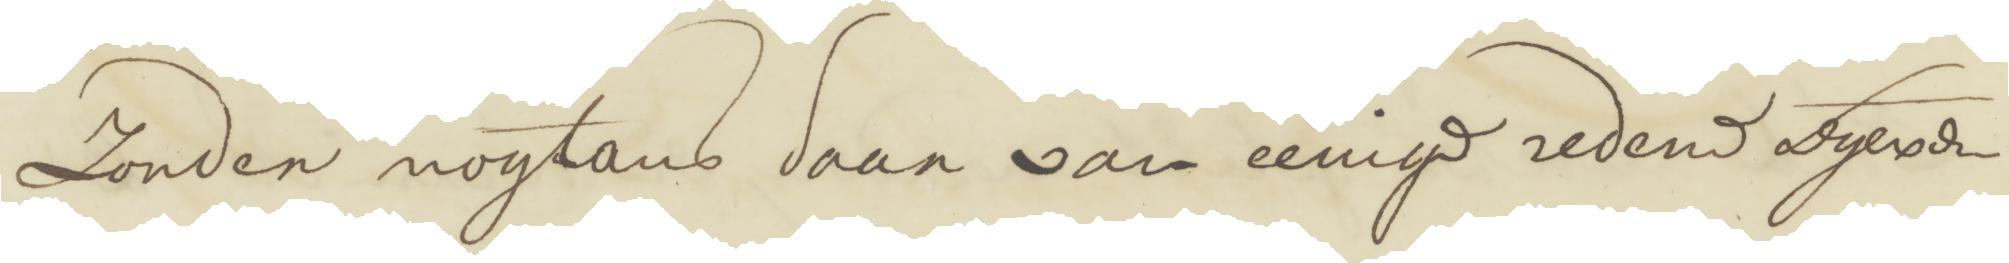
zonder nogtans daar van eenige redene tegeven
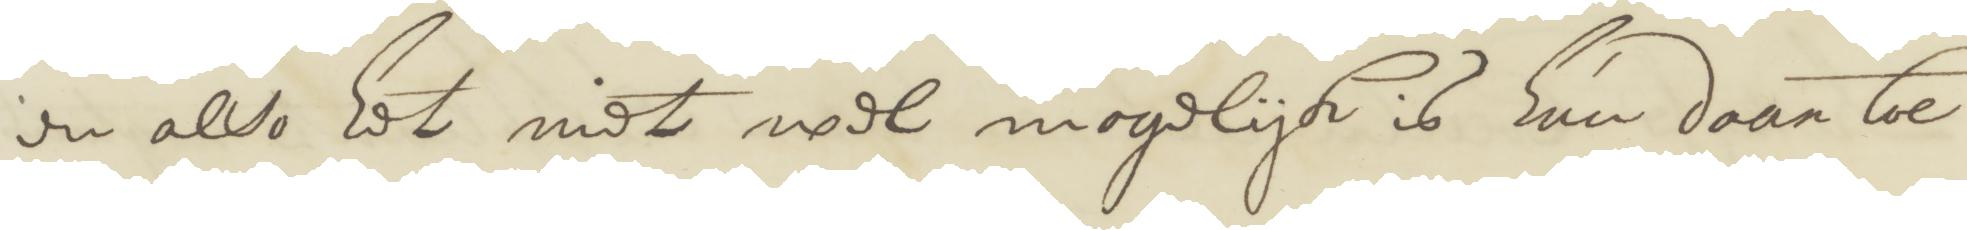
en also het niet wel mogelijk is hun daar toe
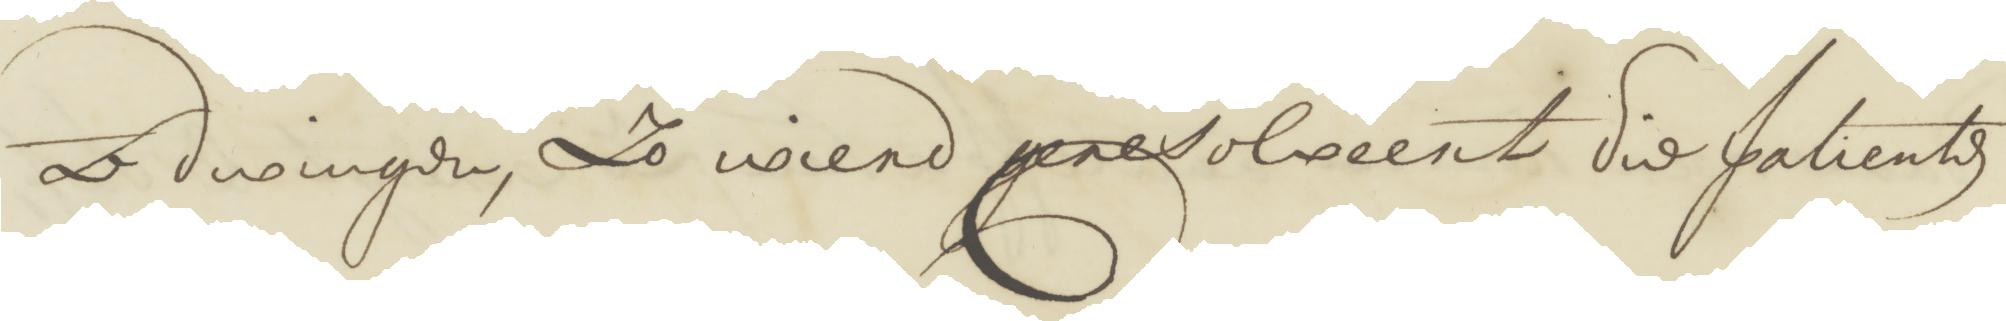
te dwingen, zo wierd geresolveert die patienten
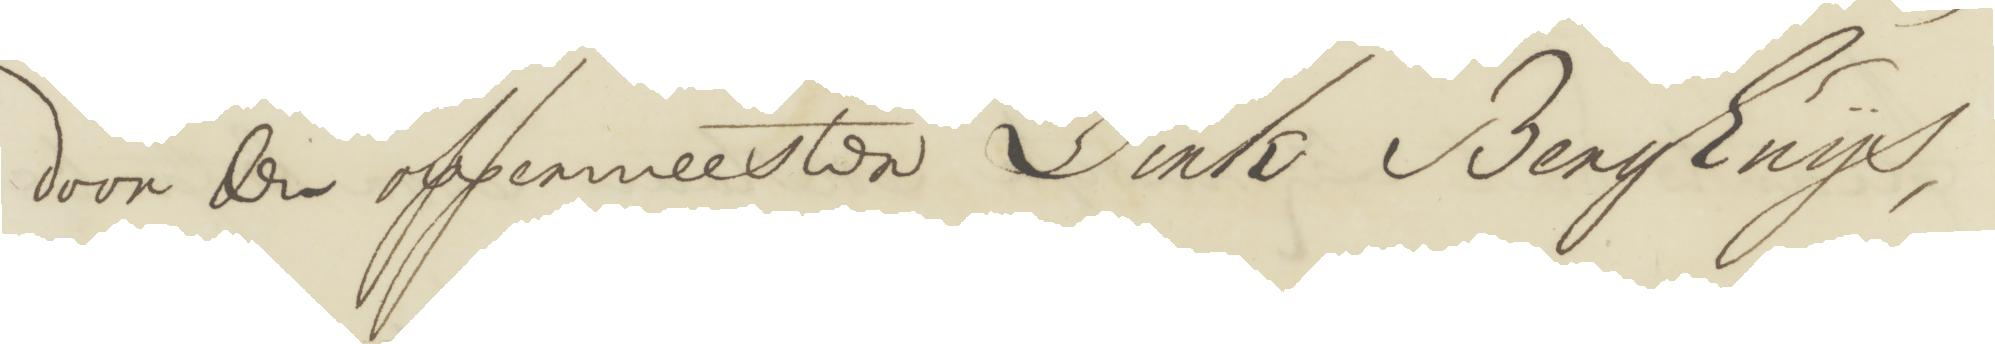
door den oppermeester Dirk Berghuijs,
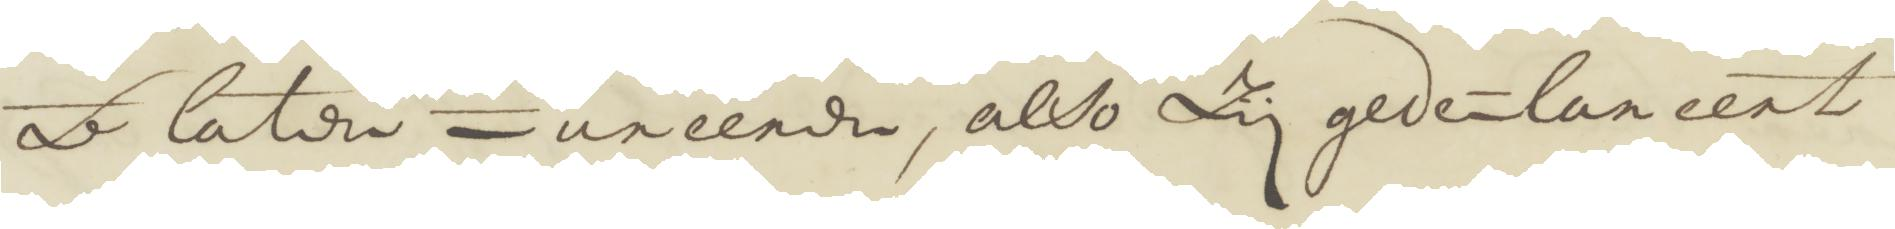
te laten cureeren, also zij gedeclareert
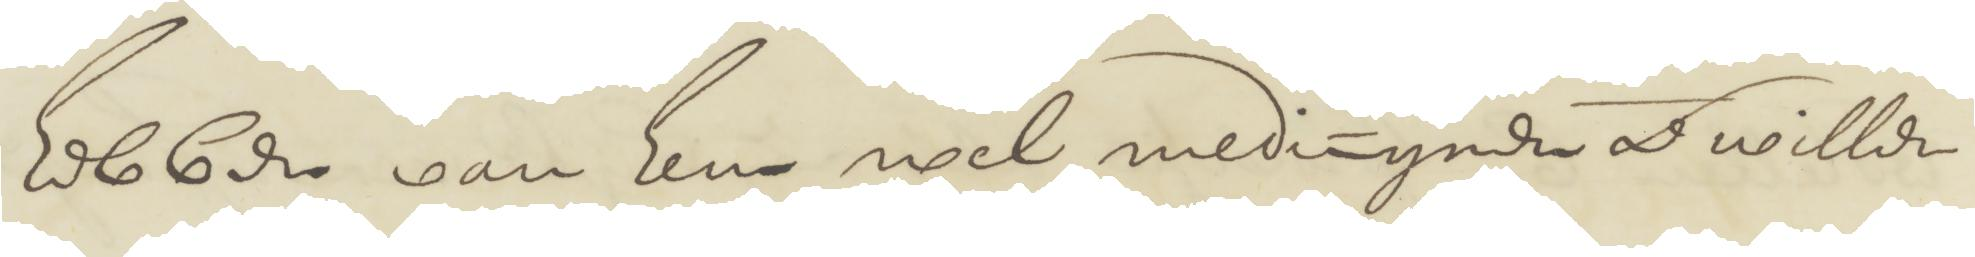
hebben van hem wel medicijnen te willen
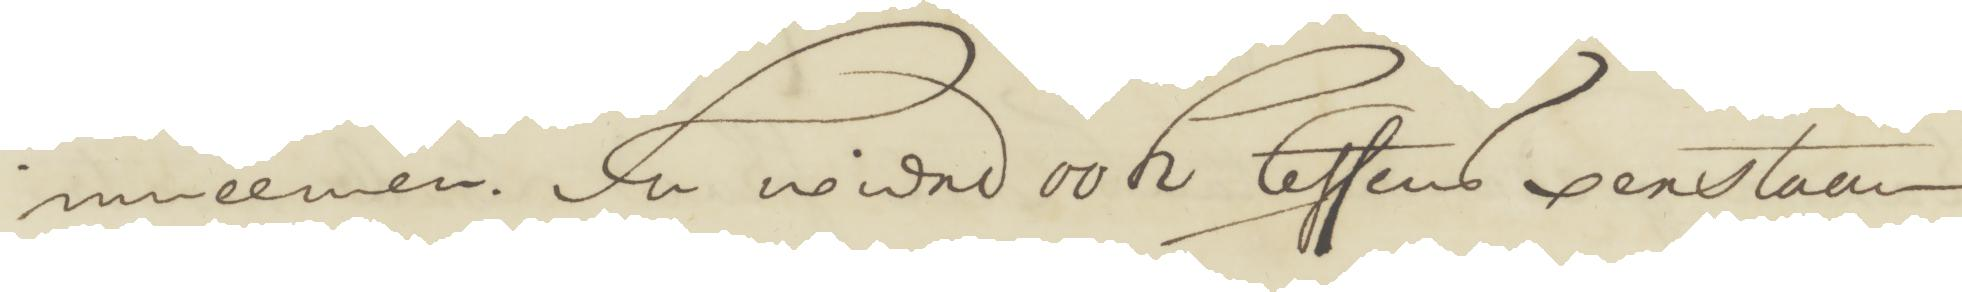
inneemen. En wierd ook teffens verstaan
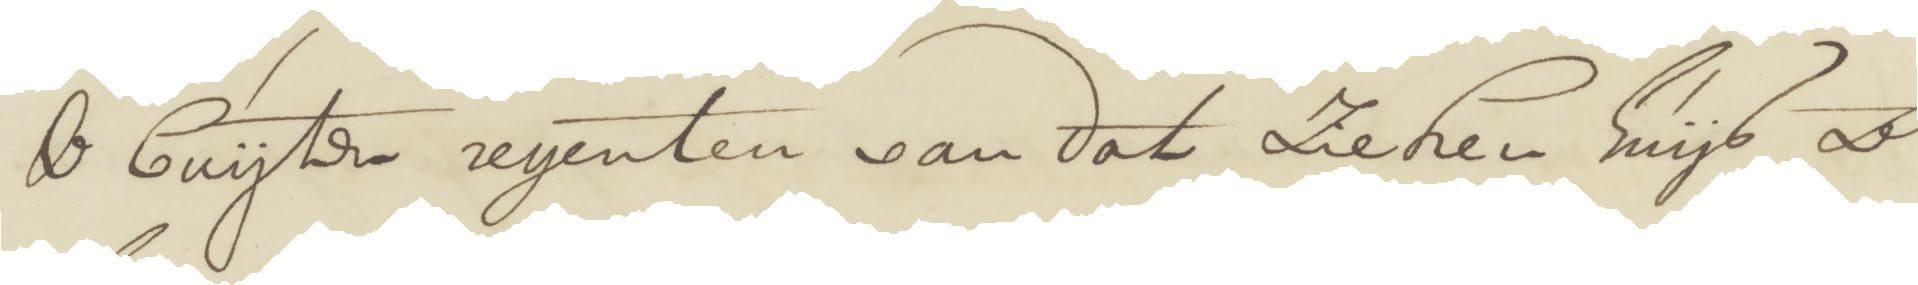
de buijten regenten van dat zieken huijs te
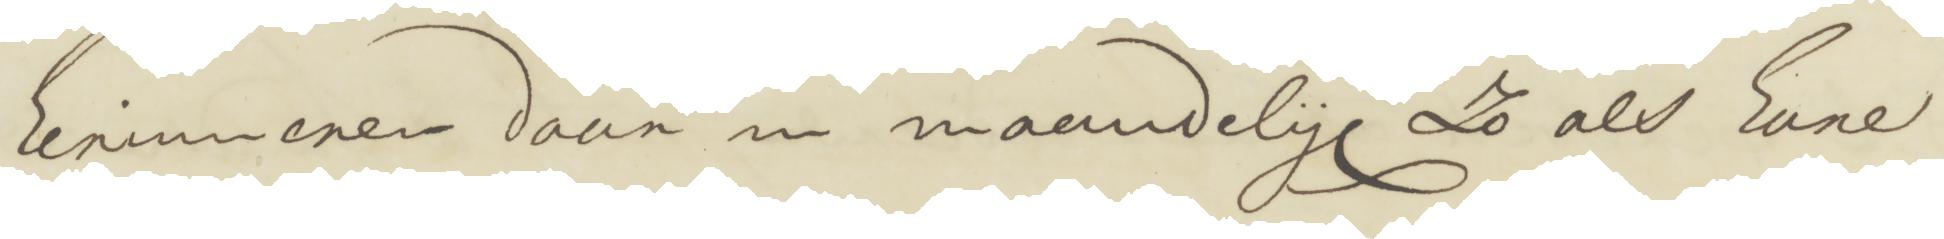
herinneren daar in maandelijx zo als hare
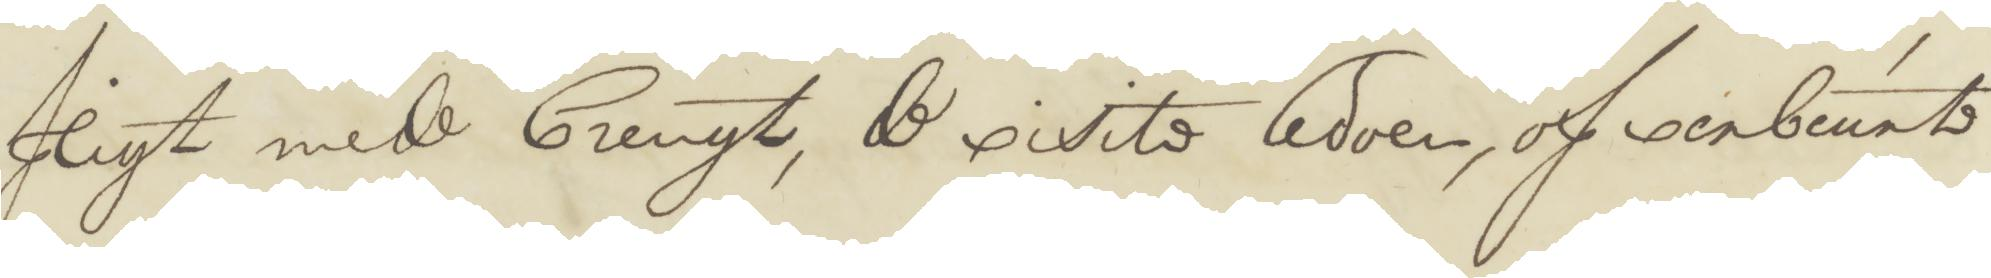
pligt mede brengt, de visite tedoen, of verbeurte
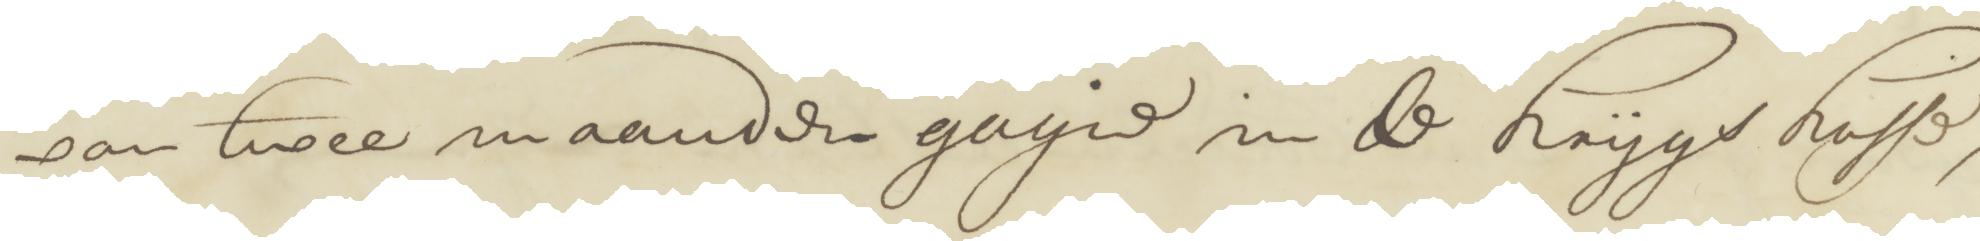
van twee maanden gagie in de krijgs kasse,
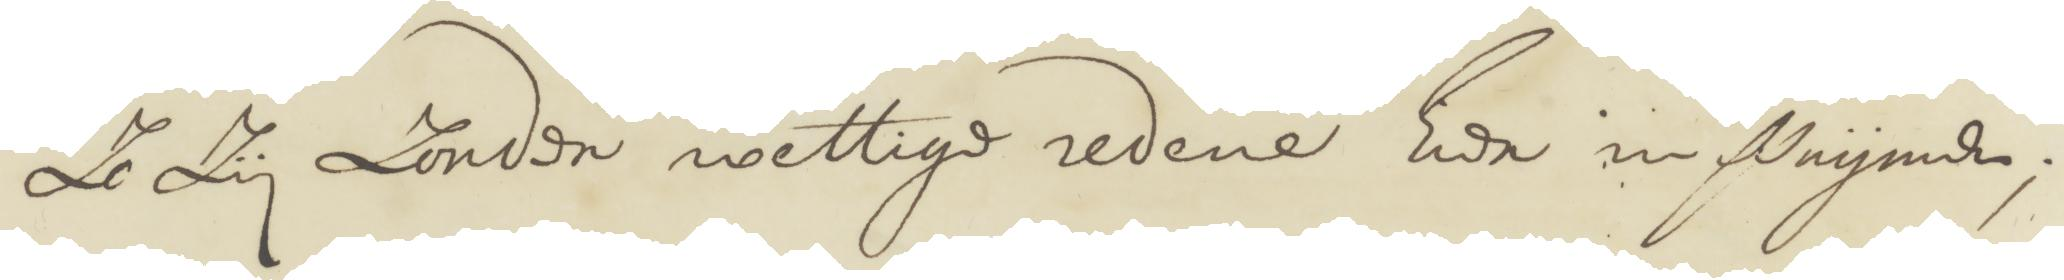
zo zij zonder wettige redene hier in prijmen;
